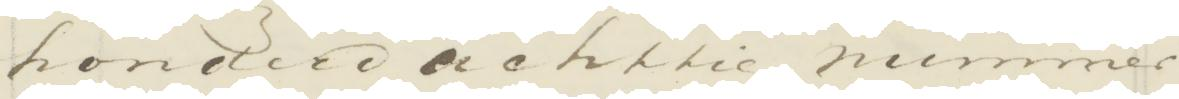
honderd achttien, nummer
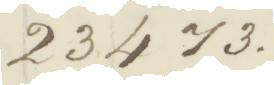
23473.
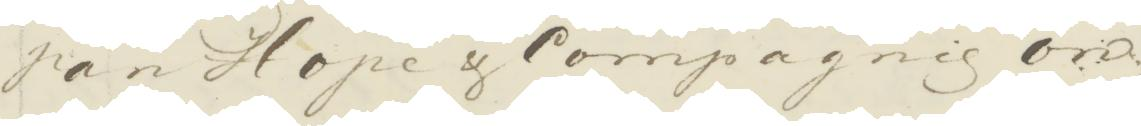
Van Hope & Compagnie on„
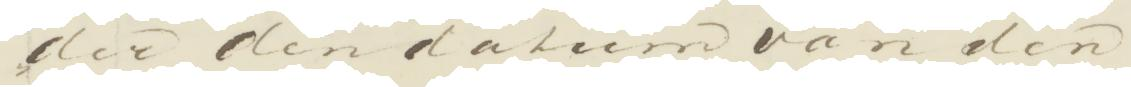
„der den datum van den
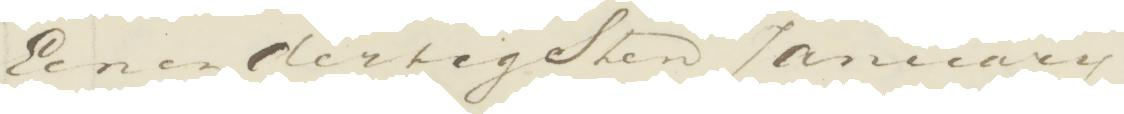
Een en dertigsten January
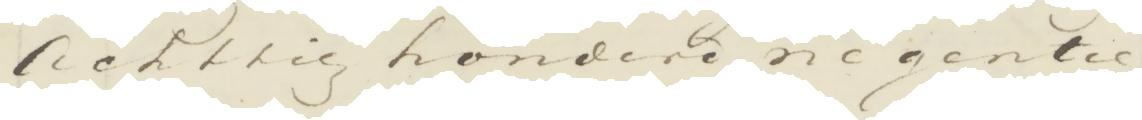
achttien honderd negentien
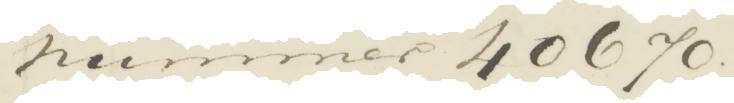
Nummer 40670.
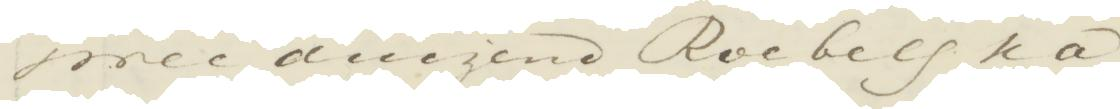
Twee duizend Roebels ka
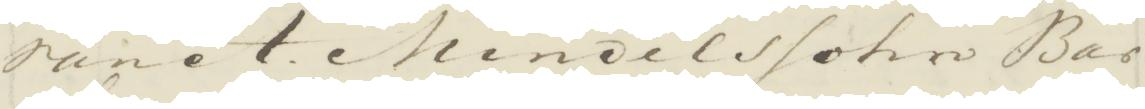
van e t Mendelssohn Bar
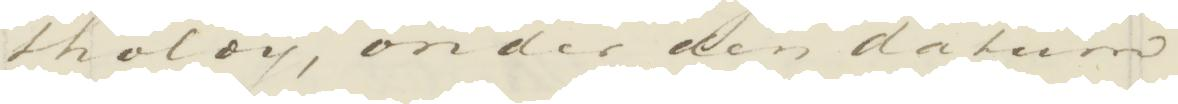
tholdij, onder den datum
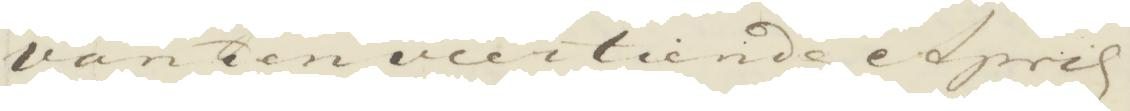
van den viertienden April
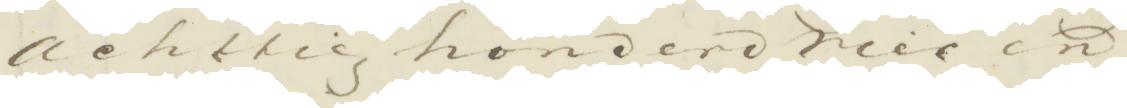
Achttien honderd vier en
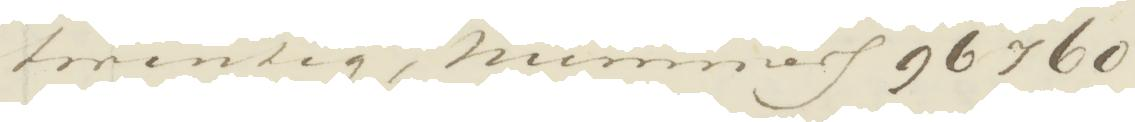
twintig, Nummers 96760
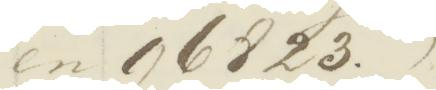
en 96823.
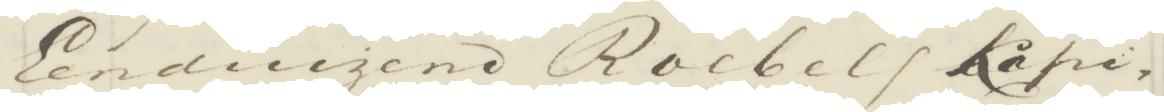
Een duizend Roebels Kapi„
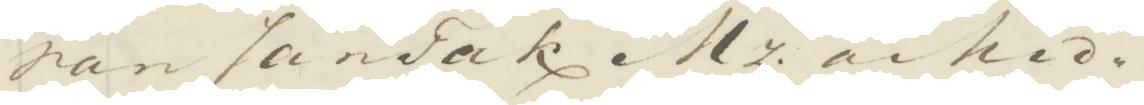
van Jan Tak Mz. a Mid„
